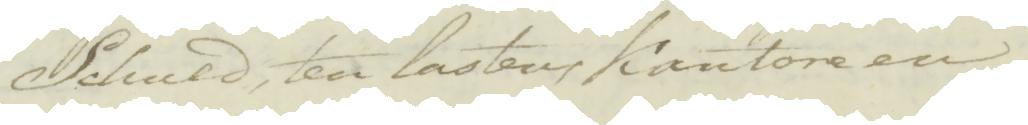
Schuld, ten lasten, Kantore en
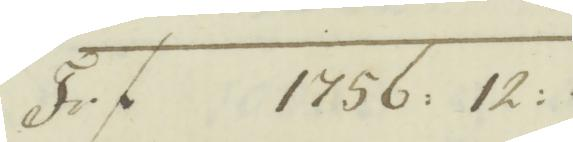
Fr. ƒ 1756: 12: —
